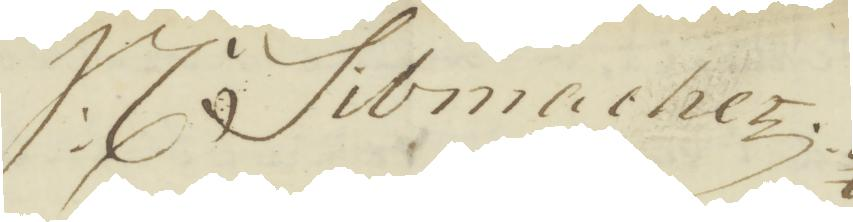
J: C: Sibmacher qq.
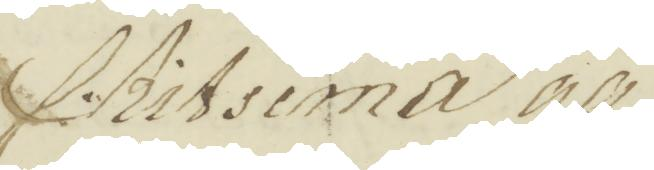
C: Ritsema qq
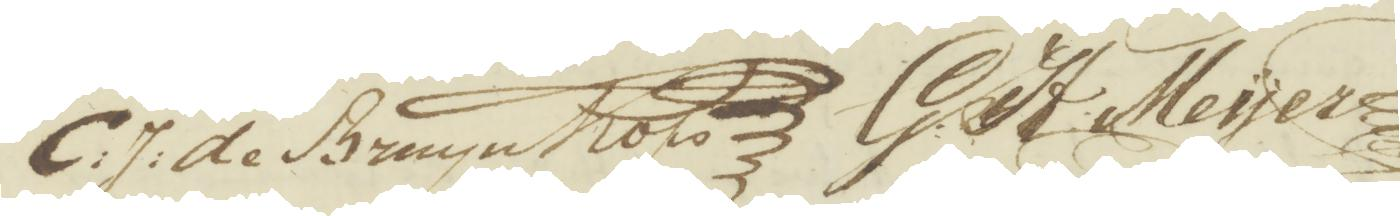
C:J: de Bruynkops G:H: Meijer
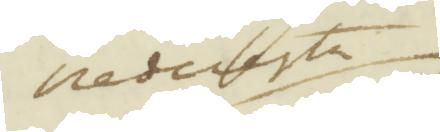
vrederegter
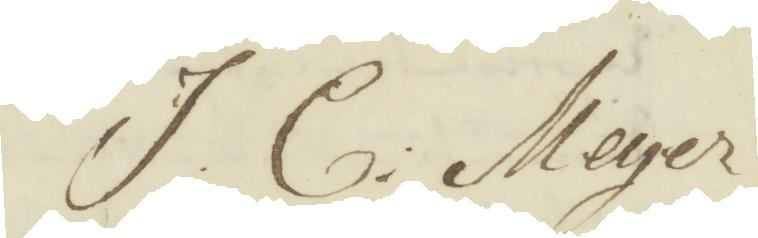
J: C: Meyer
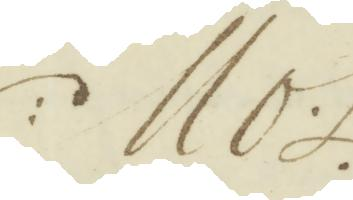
C: Mol.
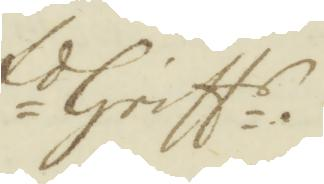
f=d Griff=s.
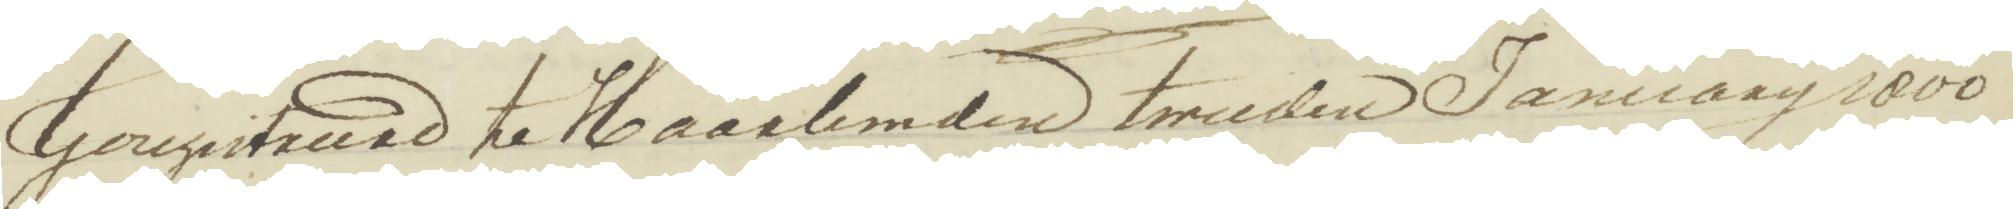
Geregistreerd te Haarlem den tweeden January 1800
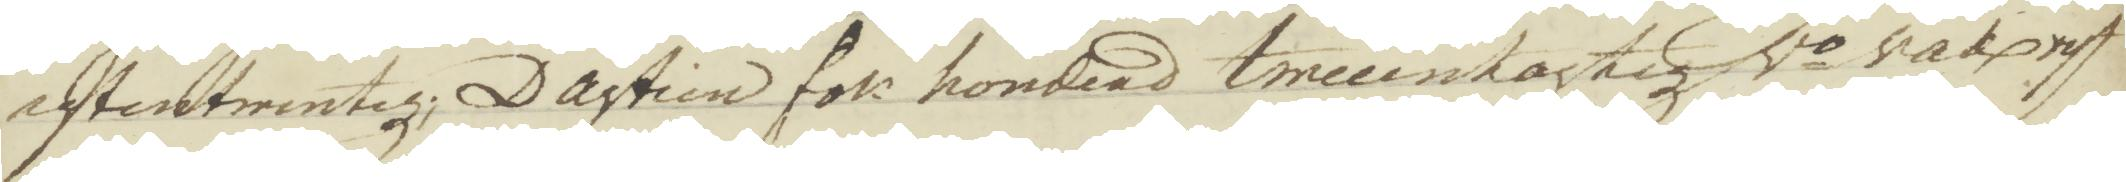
agtentwintig, D agtien fol.o honderd tweeentagtig V=o vak vyf
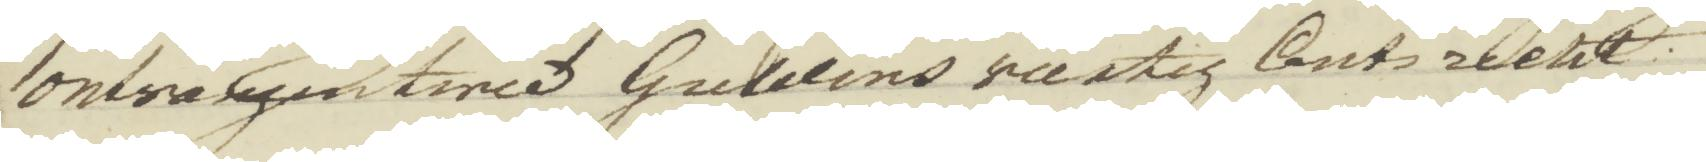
ontvangen twee Guldens veertig Cents recht.
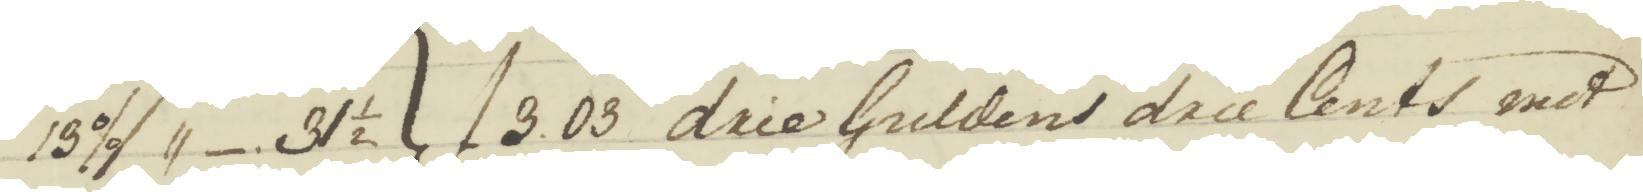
13% „ —. 31½ ƒ3.03 drie Guldens drie Cents met
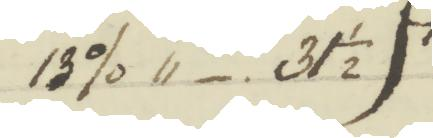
13% „ —. 31½
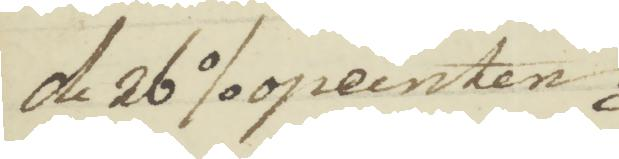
de 26% opcenten.
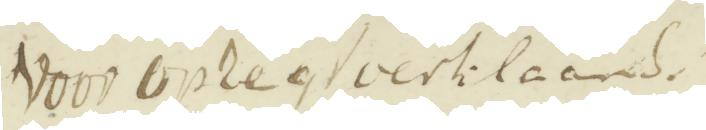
Voor opregt verklaard.
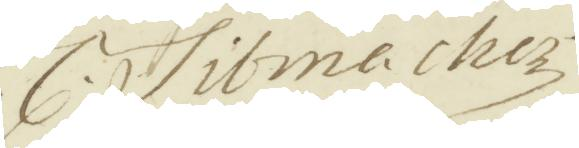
J.C. Sibmacher
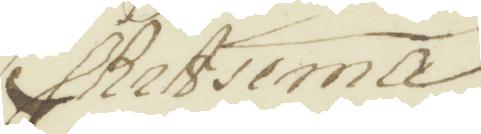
C Ritsema
